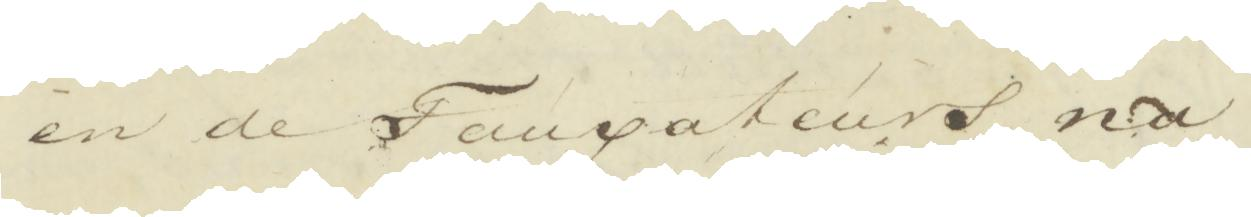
en de Tauxateurs, na
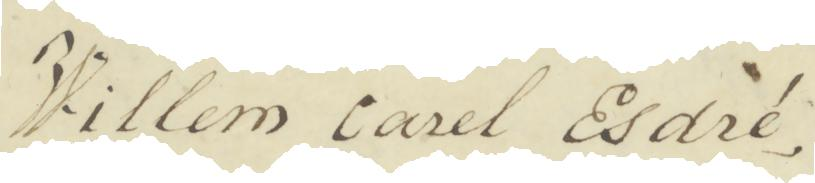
Willem Carel Esdré
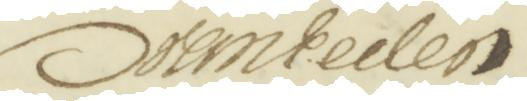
Cvanbeelen
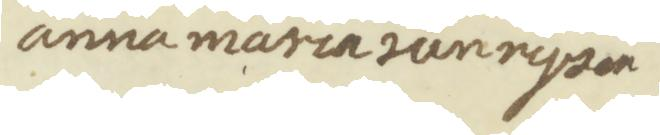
anna maria van rysen
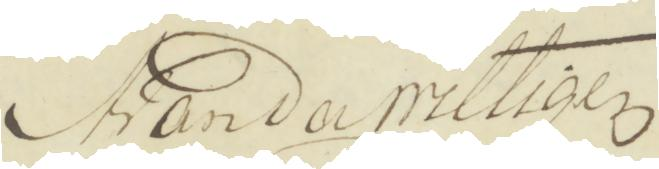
AVanderwilligen
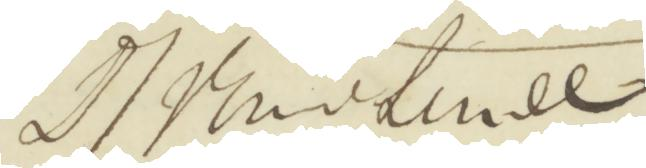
DJ vandLinde
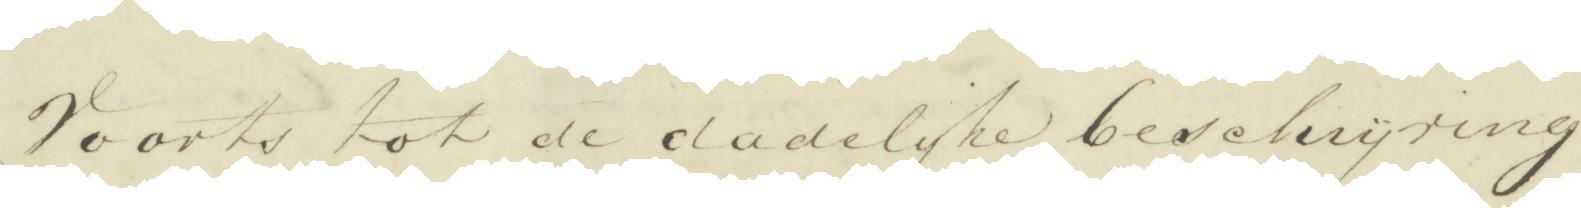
Voorts tot de dadelijke beschrijving
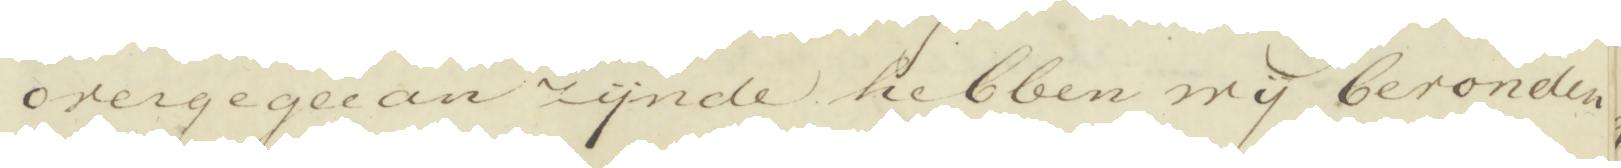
overgegaan zijnde hebben wij bevonden
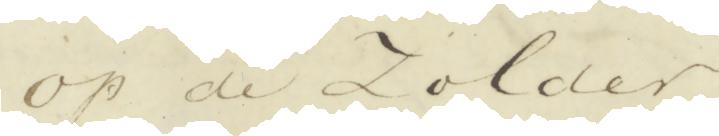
op de Zolder.
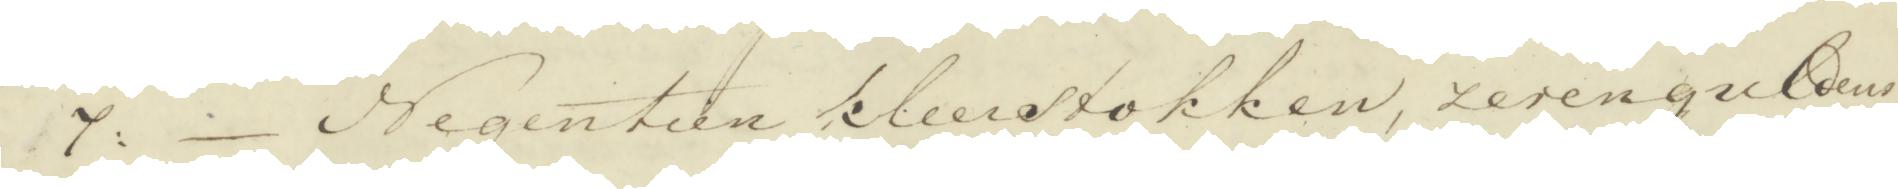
ƒ 7: — Negentien kleerstokken, zeven guldens
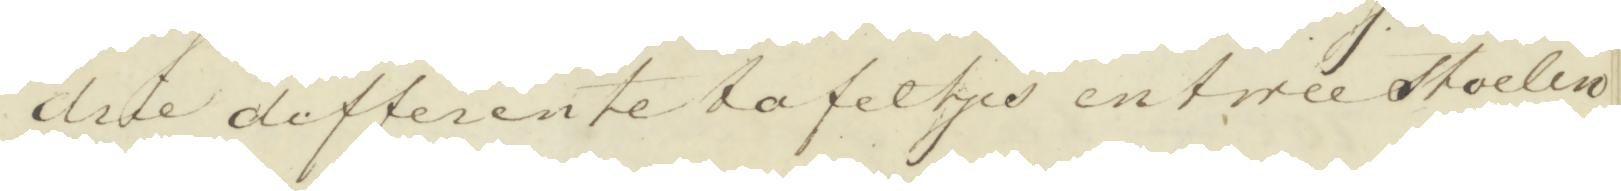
drie differente tafeltjes en twee stoelen
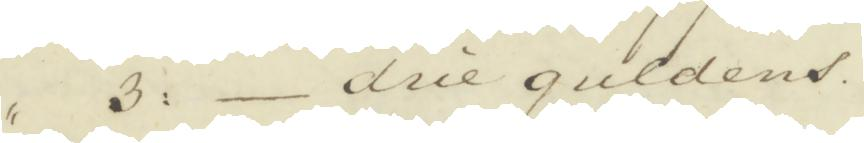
„ 3: — drie guldens.
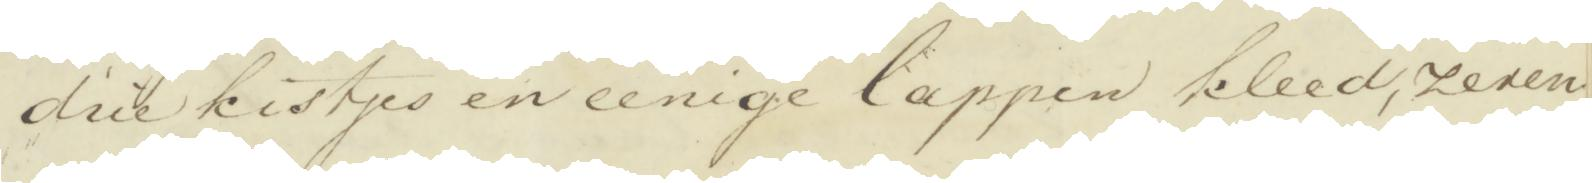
drie kistjes en eenige lappen kleed, zeven
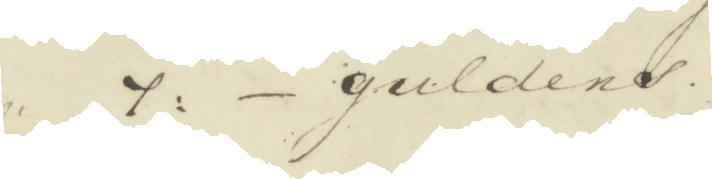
7: — guldens.
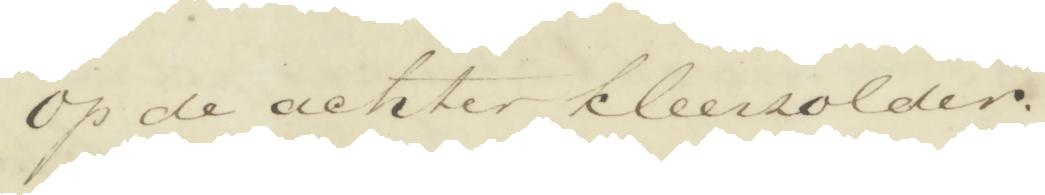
op de achter kleerzolder
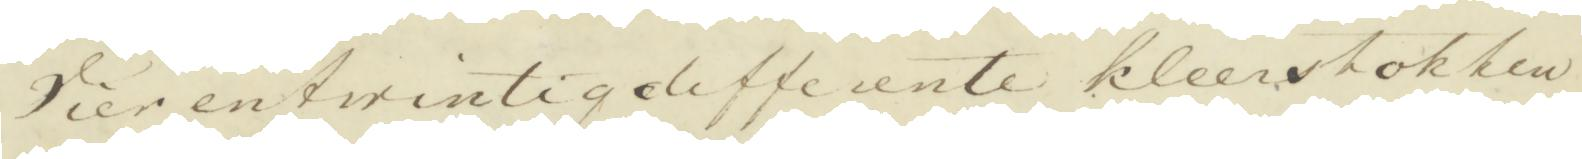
Vier en twintig differente kleerstokken
